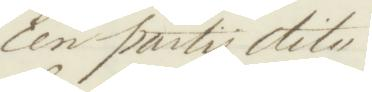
Een partij dito
